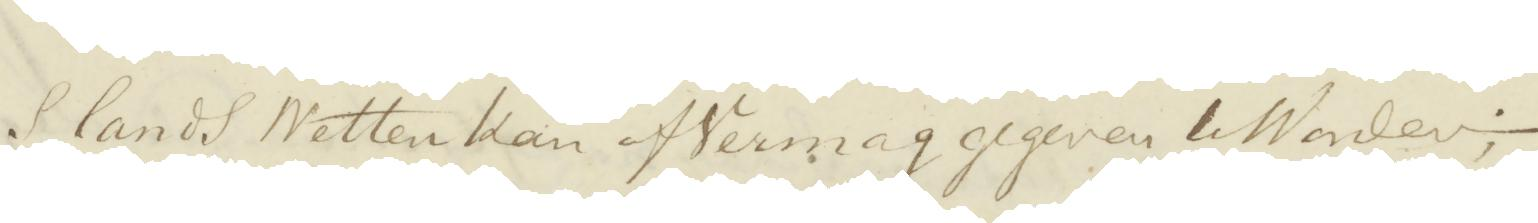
s lands wetten kan of vermag gegeven te worden;
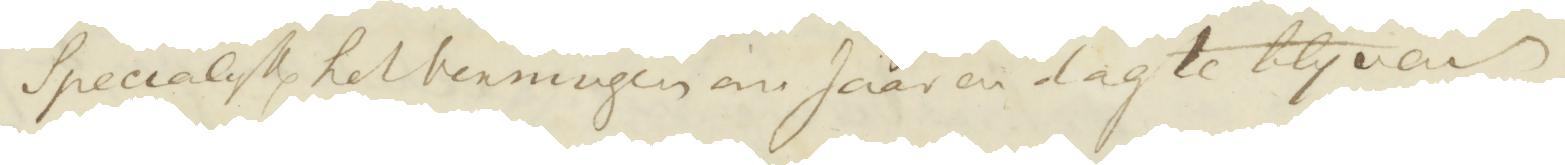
specialyk het vermogen om Jaar en dag te blyven
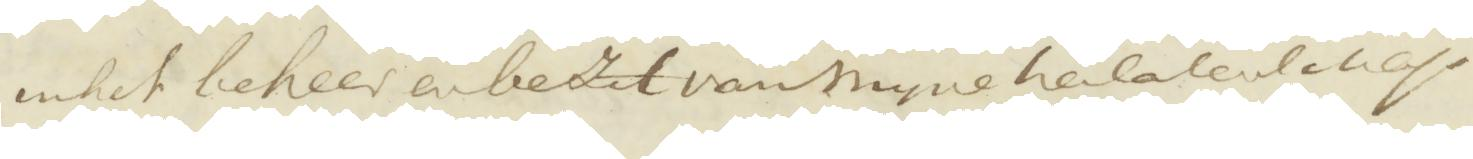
in het beheer en bezit van myne nalatenschap
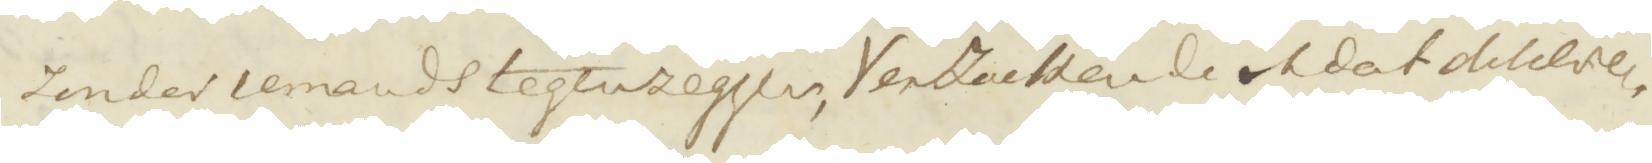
zonder iemands tegenzeggen, Verzoekende ik dat deselven
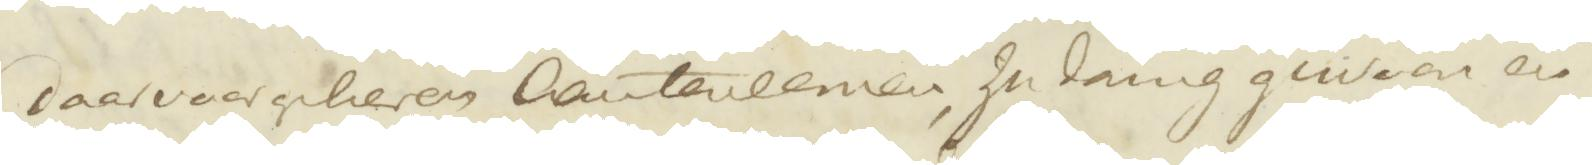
daarvoor gelieven Aanteneemen, zo danig gewoon en
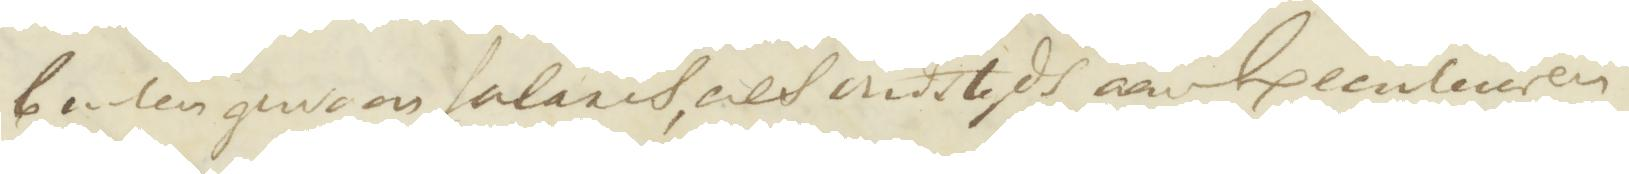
buitengewoon salaris, als indetyds aan Executeuren
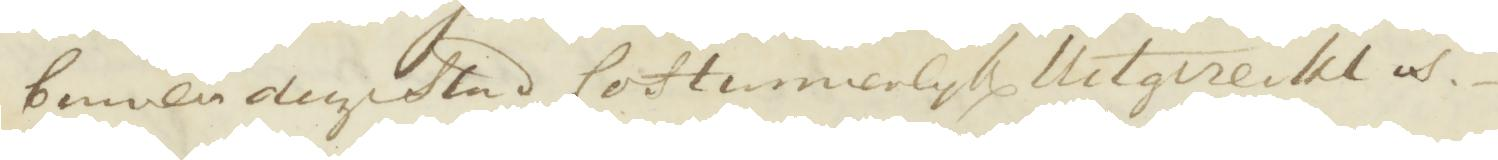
binnen deze stad Costumerlyk Uitgereikt is.
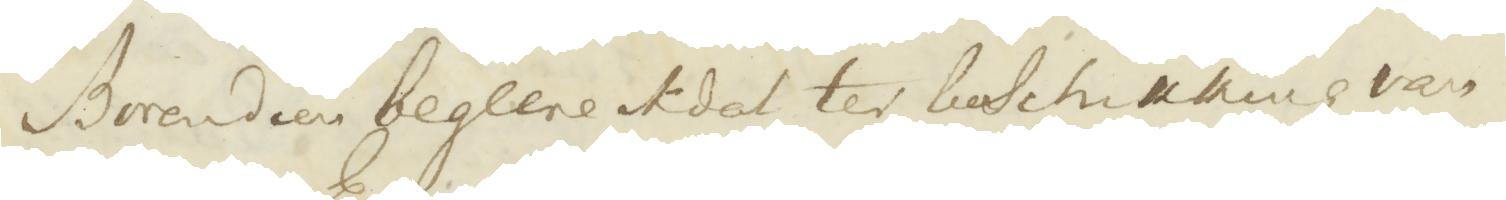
Bovendien begeere ik dat ter beschikking van
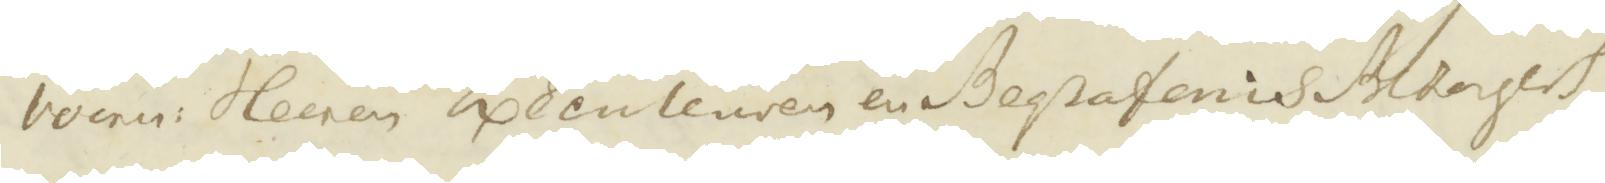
voorn: Heeren Executeuren en Begrafenis Bezorgers
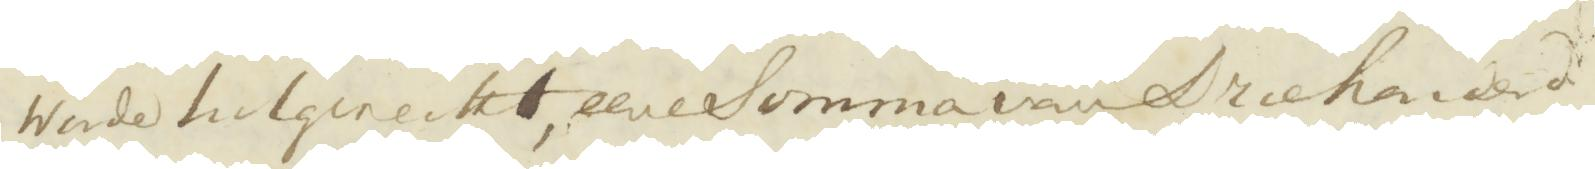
worde uitgereikt, eene somma van Driehonderd
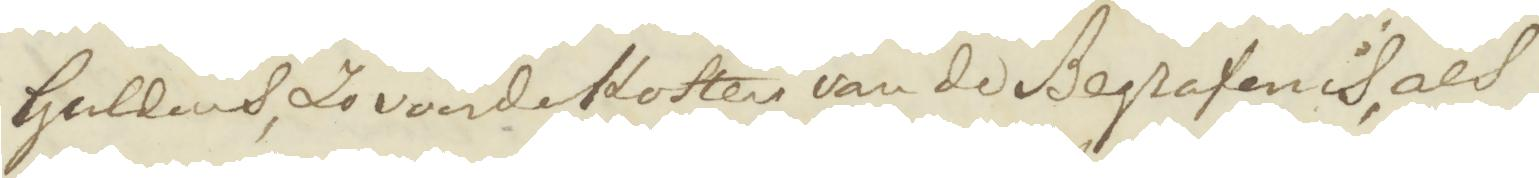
Guldens, zo voor de kosten van de Begrafenis, als
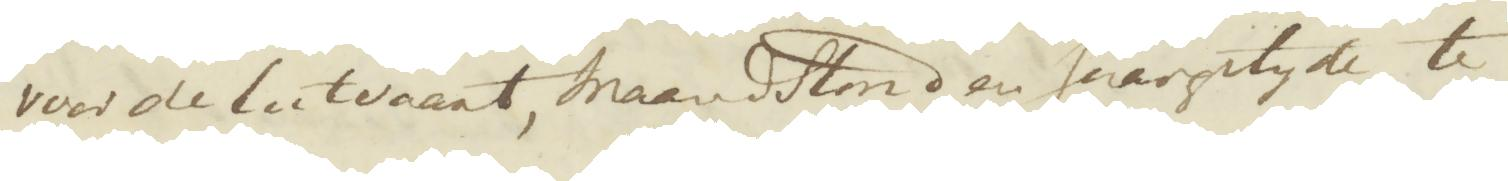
voor de uitvaart, maandstond, en Jaargetyde, te
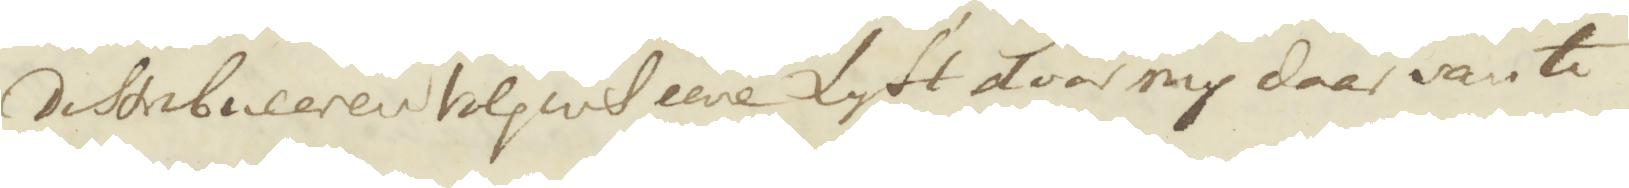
distribueeren volgens eene Lyst door my daar van te
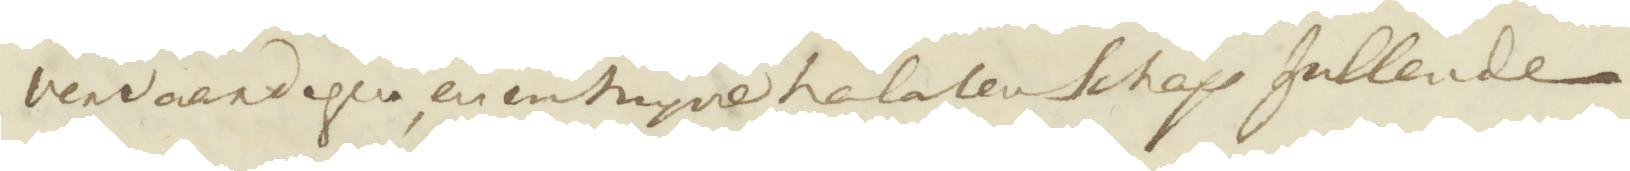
vervaardigen, en in myne nalatenschap zullende
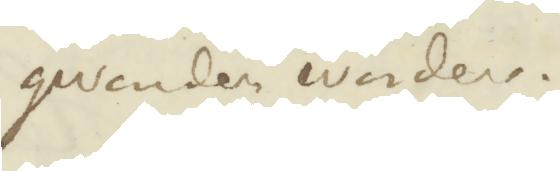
gevonden worden.
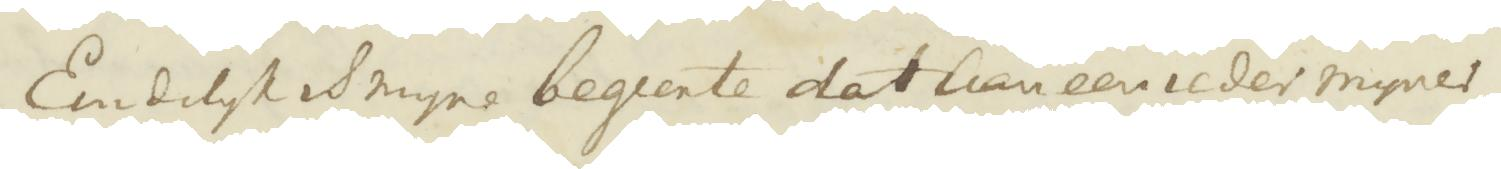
Eindelyk is myne begeerte dat Aan een ieder myne
